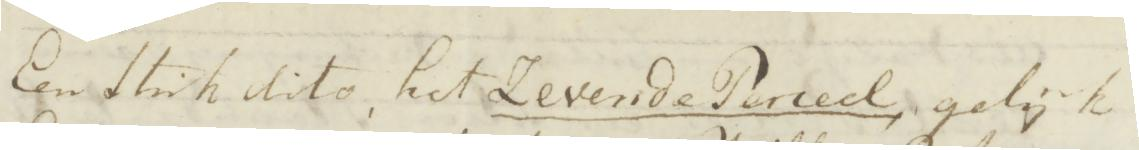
Een stuk dito, het Zevende Perceel, gelijk
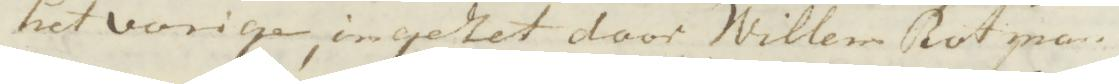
het vorige, ingezet door Willem Rotman
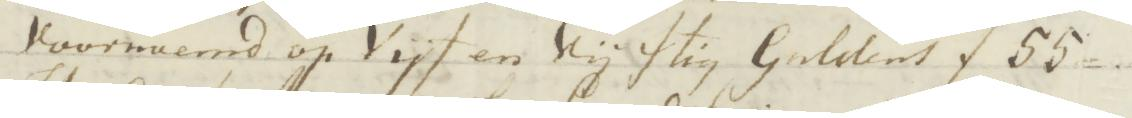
Voornoemd op Vijf en Vijftig Guldens ƒ 55=
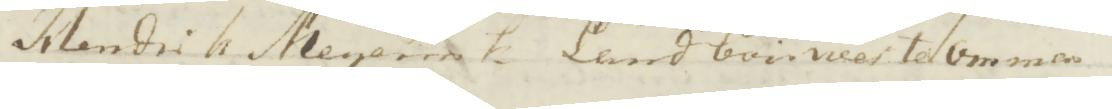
Hendrik Meyerink Landbouwer te Ommen
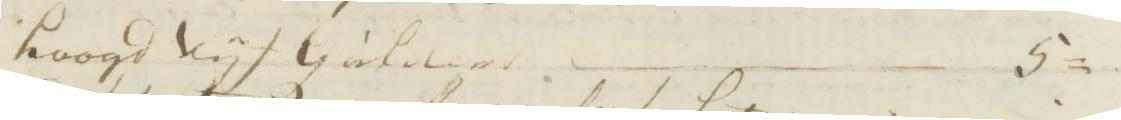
hoogd vijf Gulden — 5=
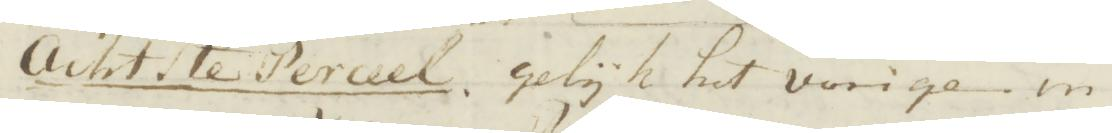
Achtste Perceel, gelijk het vorige in
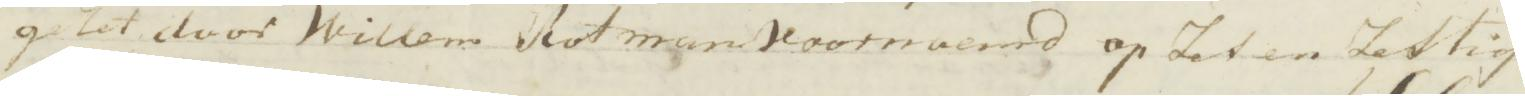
gezet door Willem Rotman voornoemd op Zes en Zestig
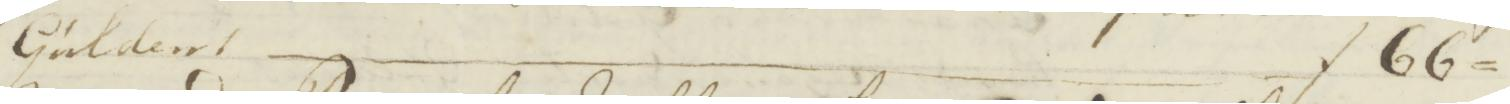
Guldens — „ 66=
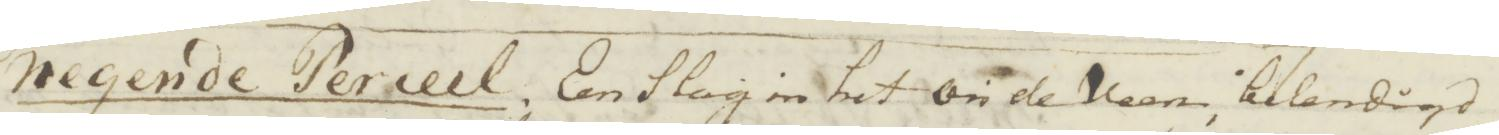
negende Perceel. Een Slag in het oude Veen, belendigd
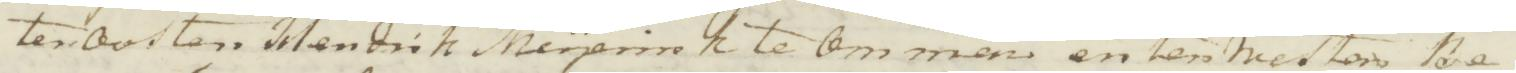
ten Oosten Hendrik Meijerink te Ommen en ten Westen Be
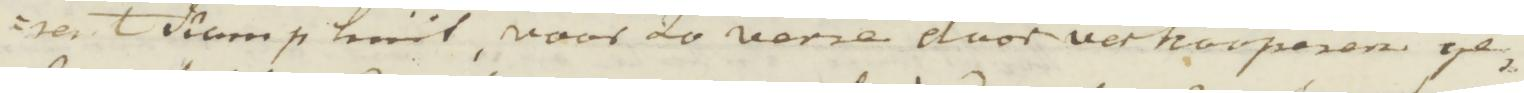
rent Kamphuis, voor Zo verre door verkooperen ge„
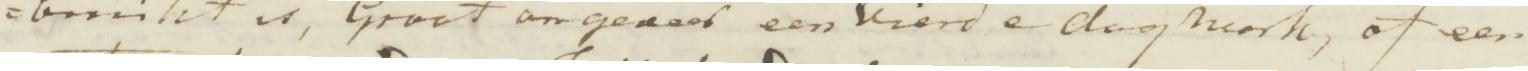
=bruikt is, Groot ongeveer een vierde dagwerk, of een
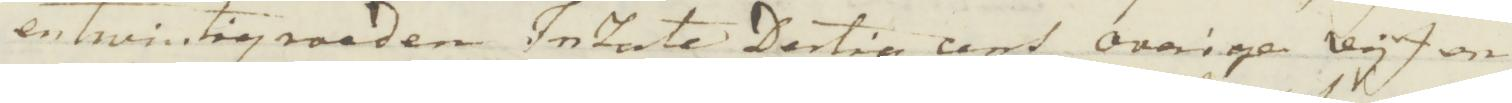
en twintig roeden In Zate Dertig cent, overige vijf en
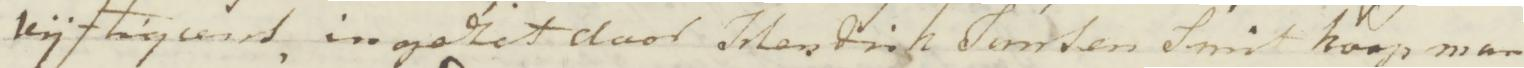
vijftig cents, in gezet door Hendrik Iansen Smit koopman
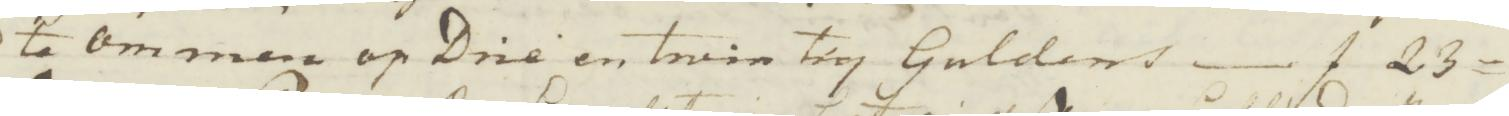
te ommen op Drie en twintig Guldens. — ƒ 23=
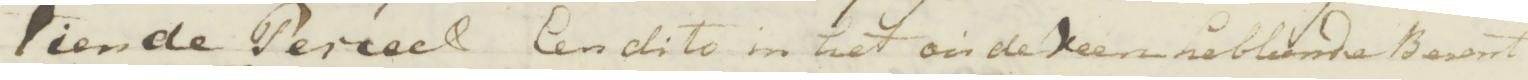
Vierde Perceel Een dito in het oude Veen hebbende Berent
